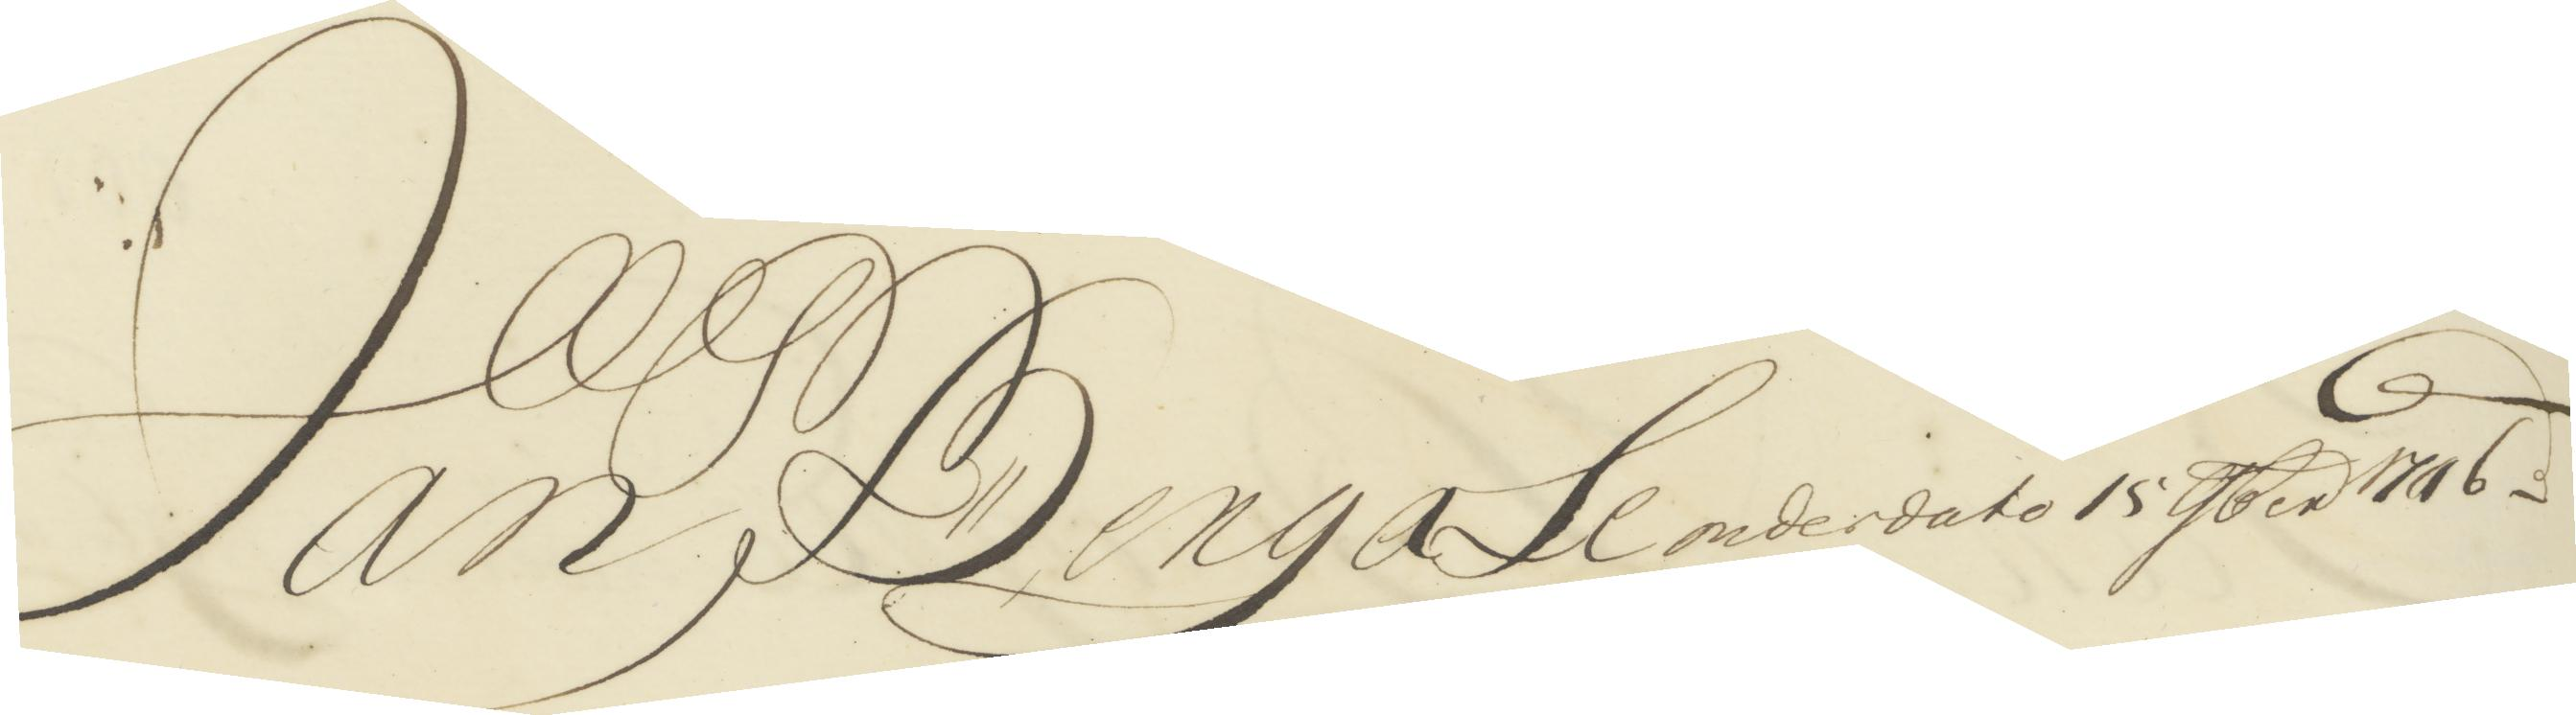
Van Bengale onder dato 15 9ber 1736
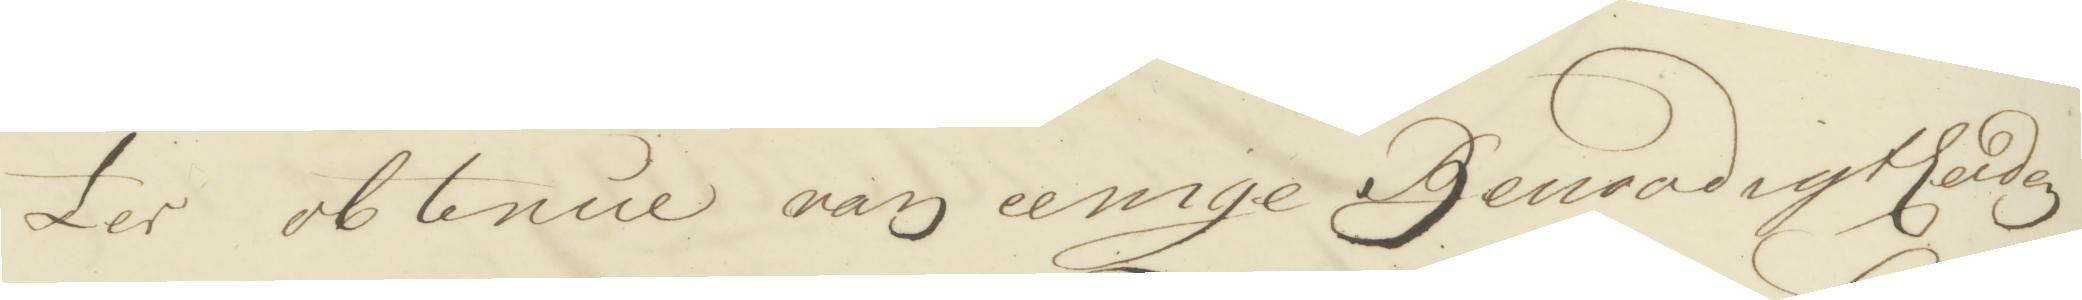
ter obtenue van eenige Benoodigtheeden
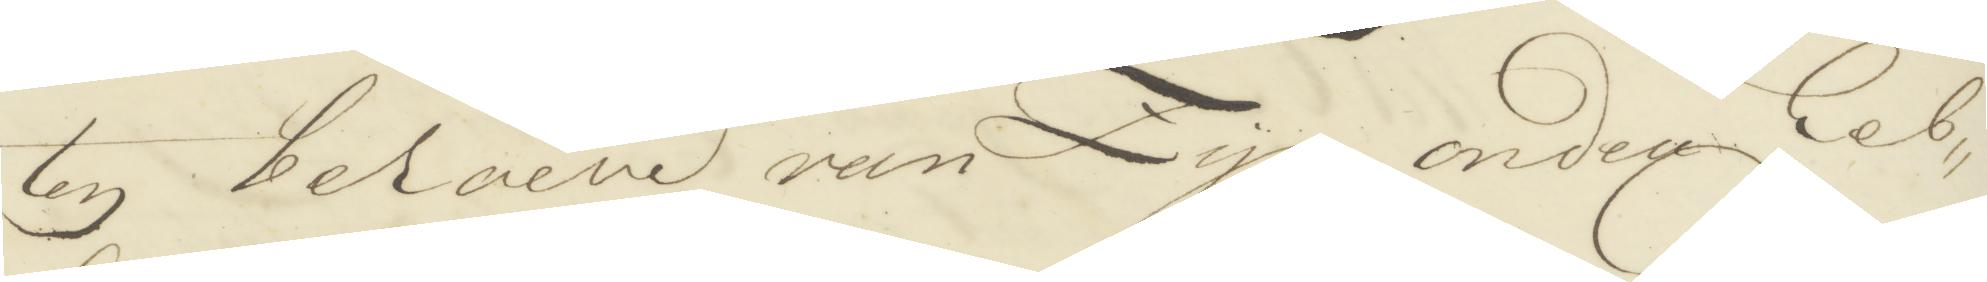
ten behoeve van zijn onder heb„
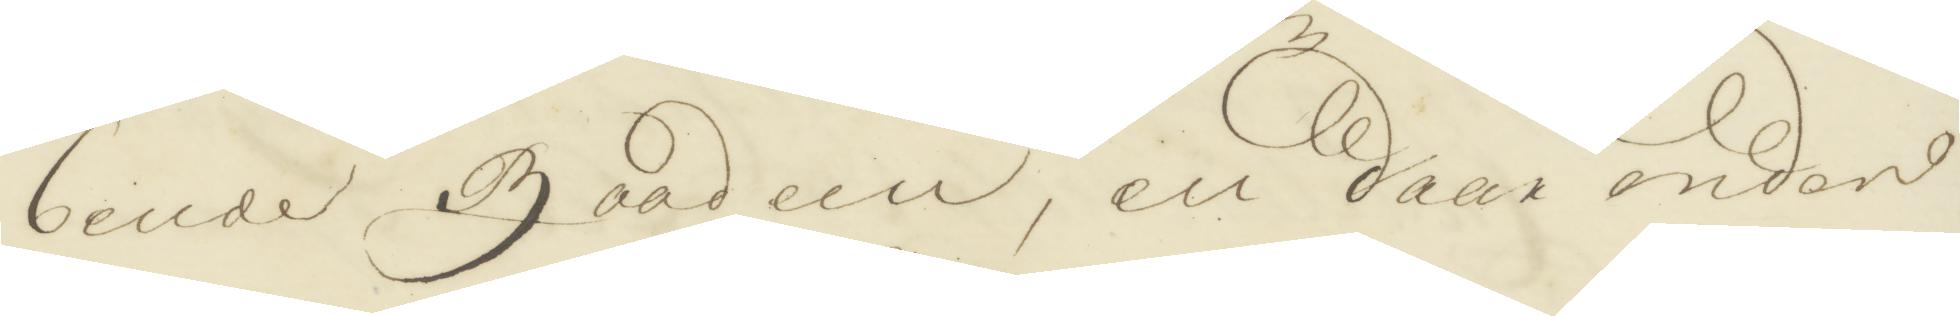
bende Bood een, en daar andere
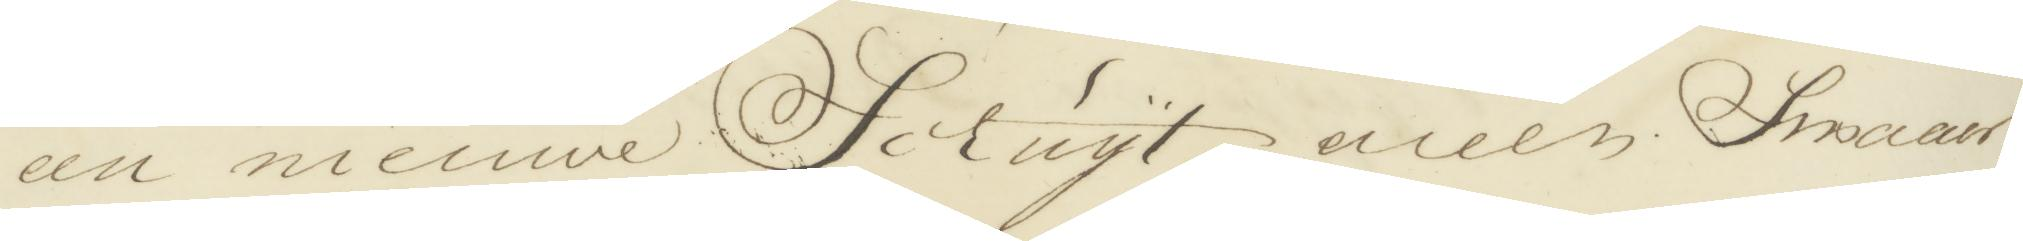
een nieuwe Schuijt en een Swaar
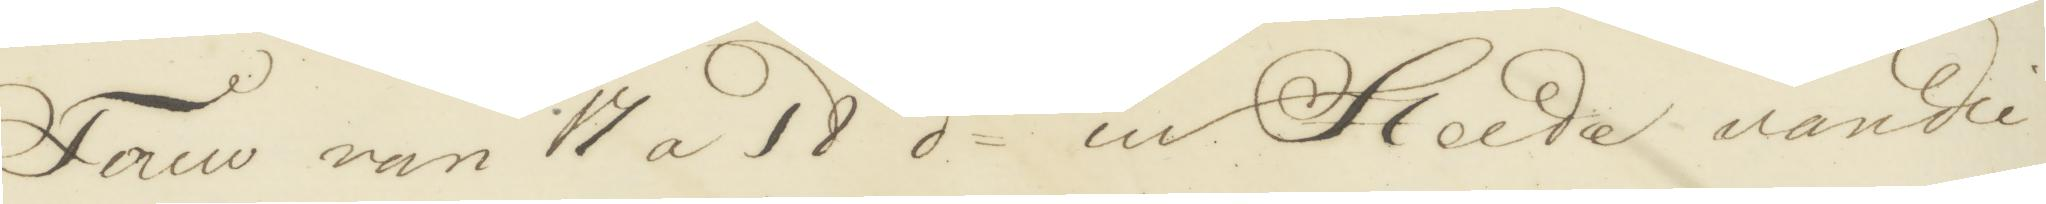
Touw van 17 a 18 d=m en Steede van die
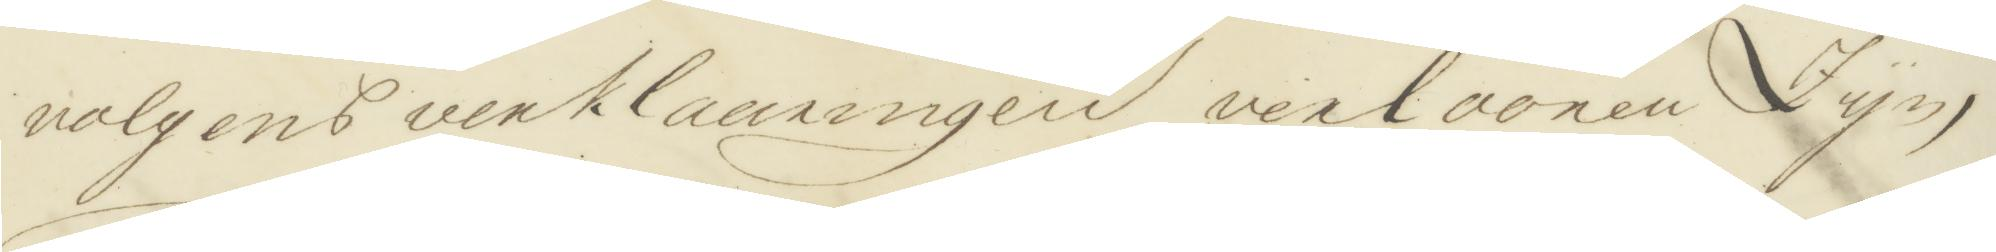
volgens verklaaringen verlooren zijn,
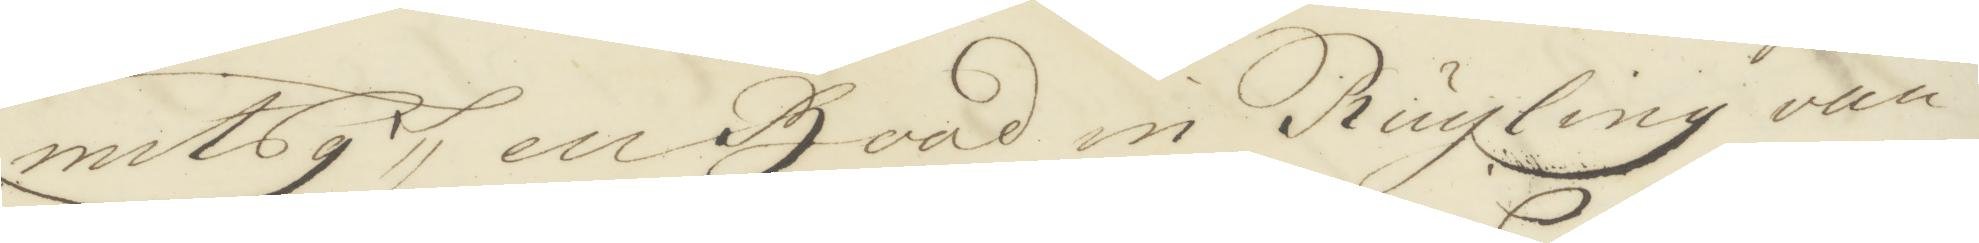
mitsg„s en Rood in Ruijling van
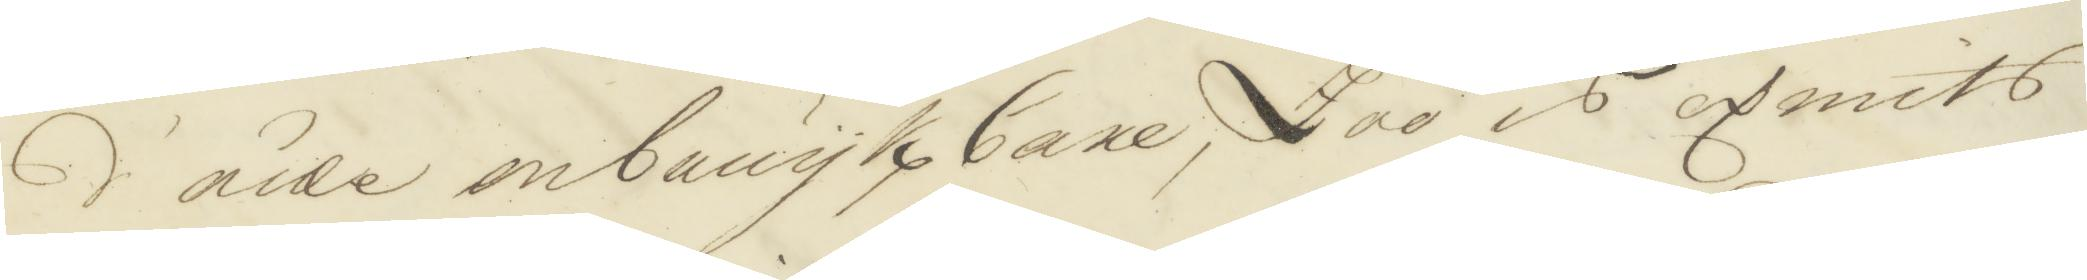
d’oude onbruijkbare, zoo is overmits
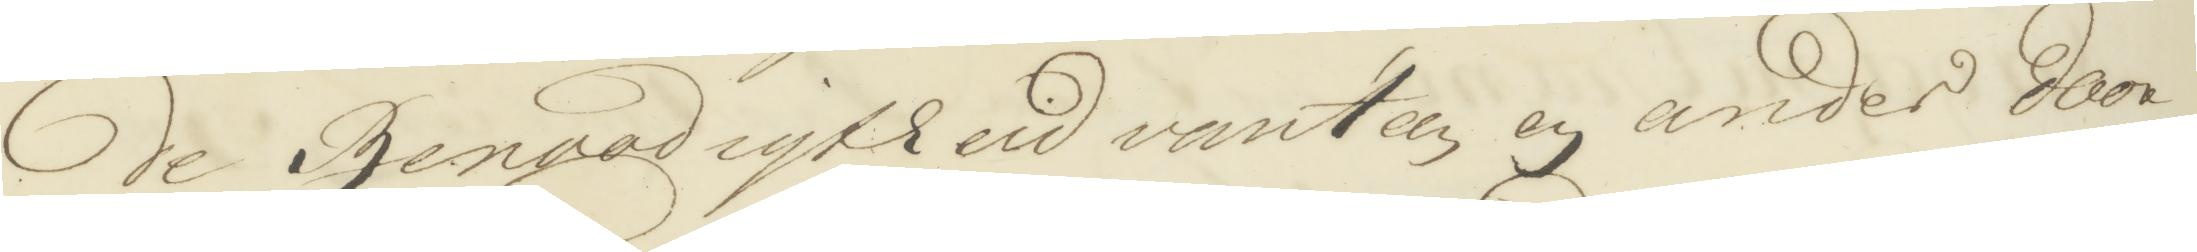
de Benoodigtheid van't een en ander door
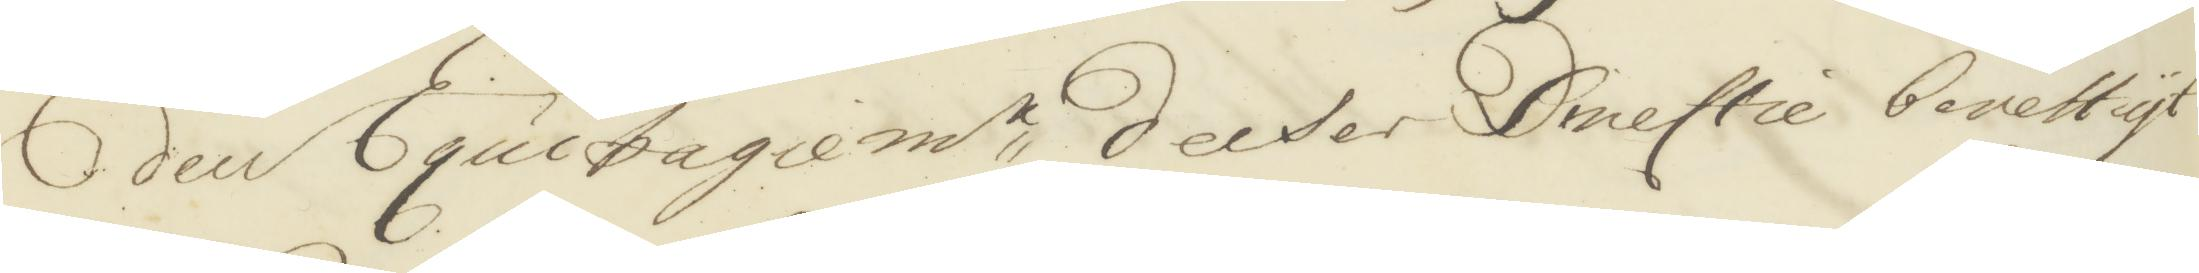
den Equepagiem„r deeser Directie bevestigt
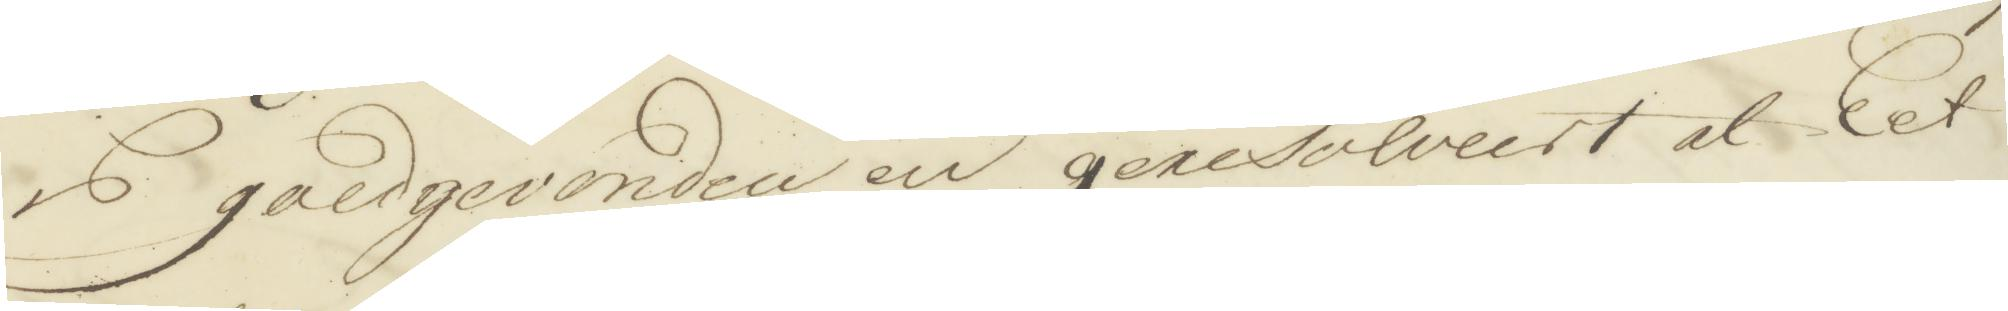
is goedgevonden en geresolveert al het
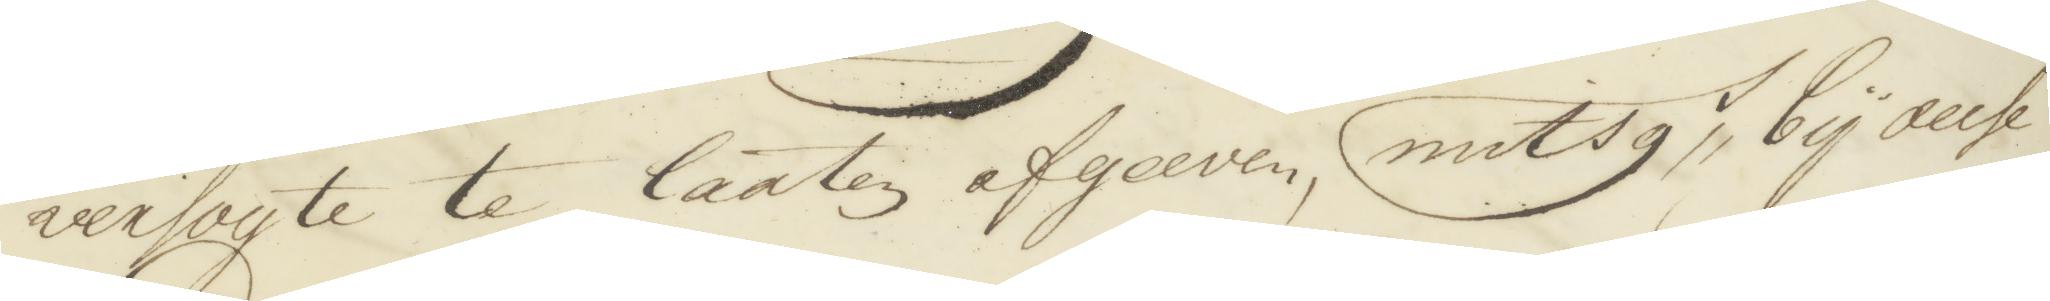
versogte te laaten afgeeven, mitsg„s bij deese
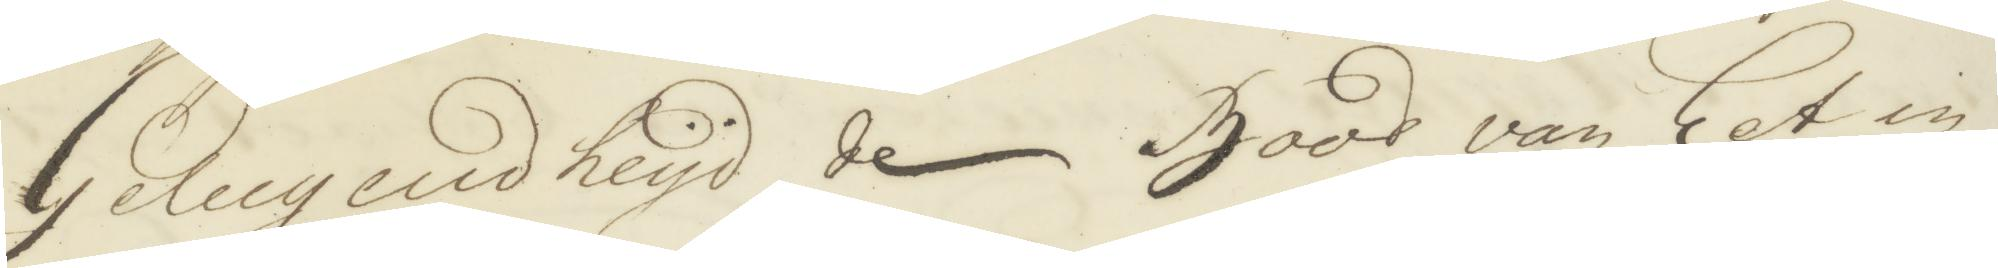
Geleegendheijd de Bood van het in
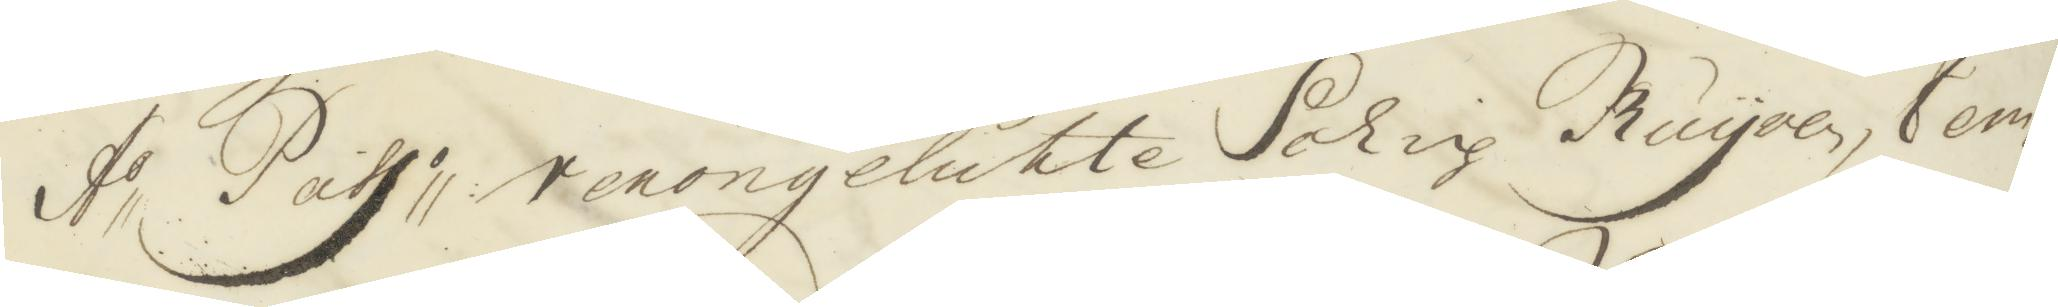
A„o Pass„o verongelukte Schip Ruijven, 't em
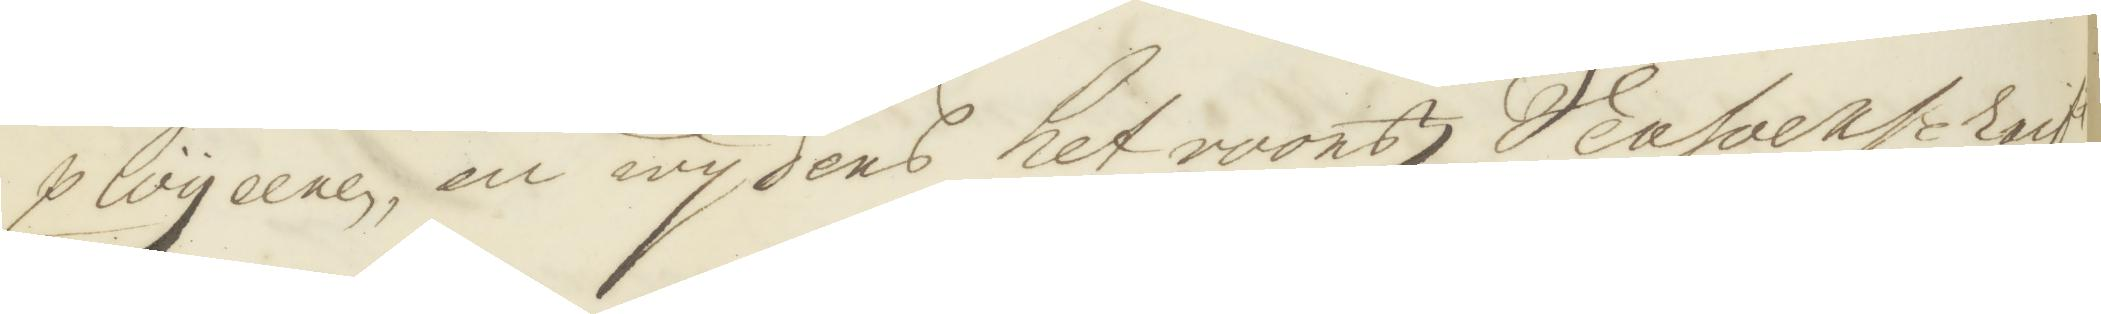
ploijeeren, en wijders het voorsz Versoekschrif
